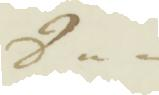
8 „ —
